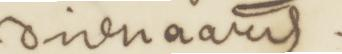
dienaaren
